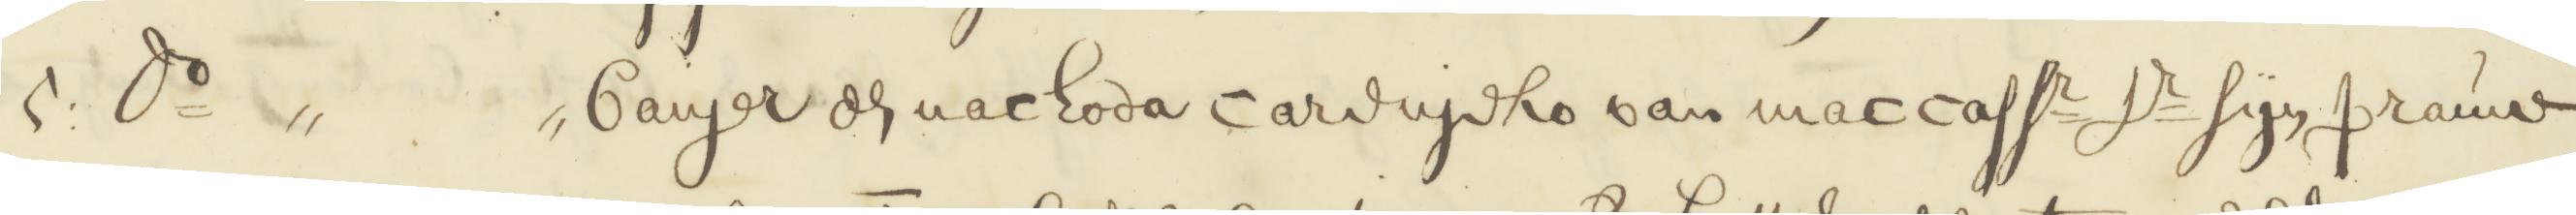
5: d=o „ „banjer den nachoda carenjeko van maccass=r P=r sijn prauw
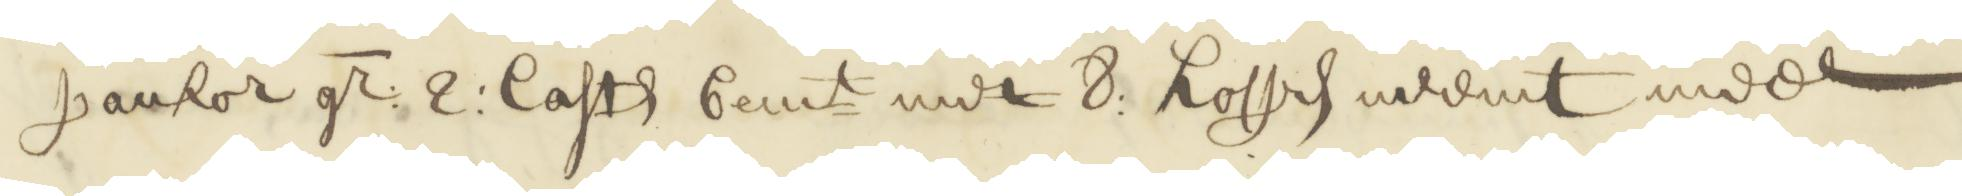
pankor gr: 2: lasten bem=t met 8: koppen neemt mede
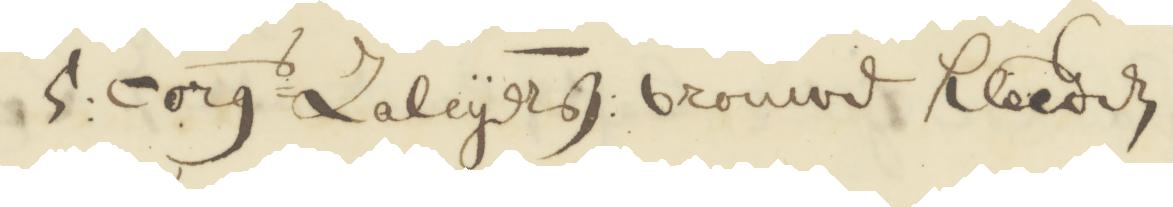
5: Corg=s Zaleijers: vrouwe kleeden
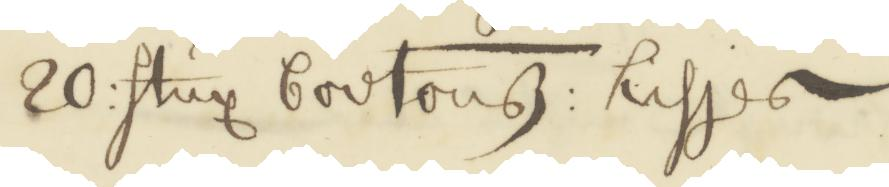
20: stux boetons: kisjes
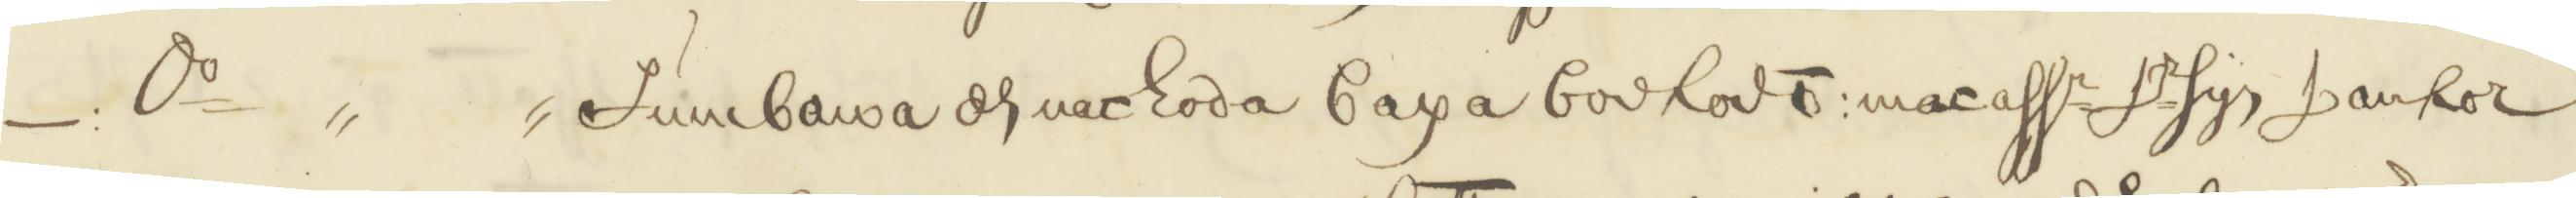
—: d=o „ „ Sumbawa den nachoda baya boekoet: macass=r p=r sijn pankor
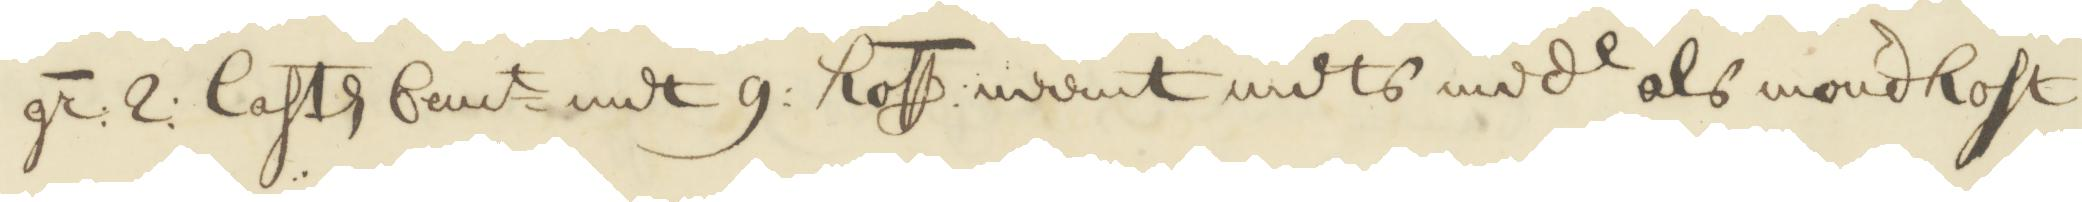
gr: 2: lasten bem=t met 9: kopp: neemt niets mede als mondkost
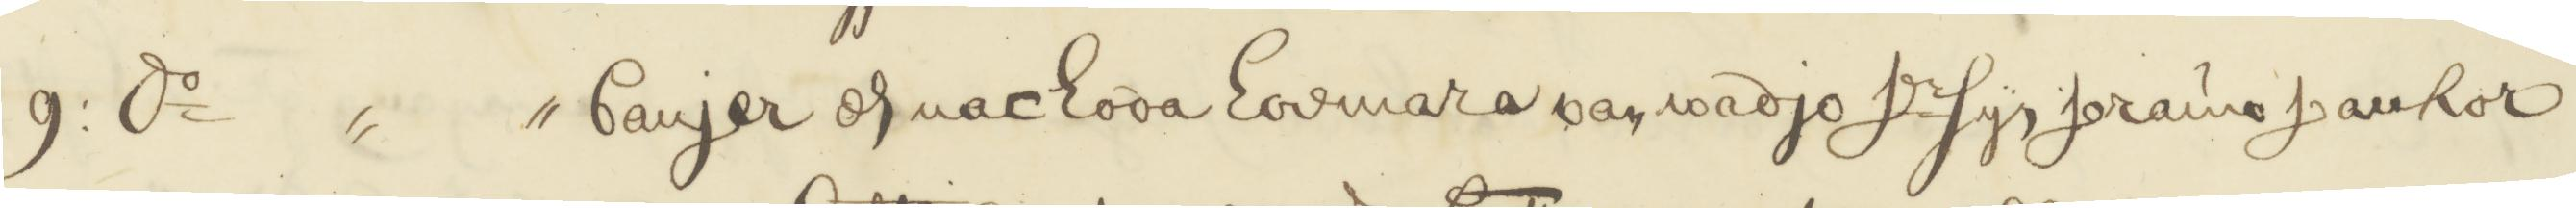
9: d=o „ „ banjer den nachoda hoemara van wadjo p=r sijn prauw pankor
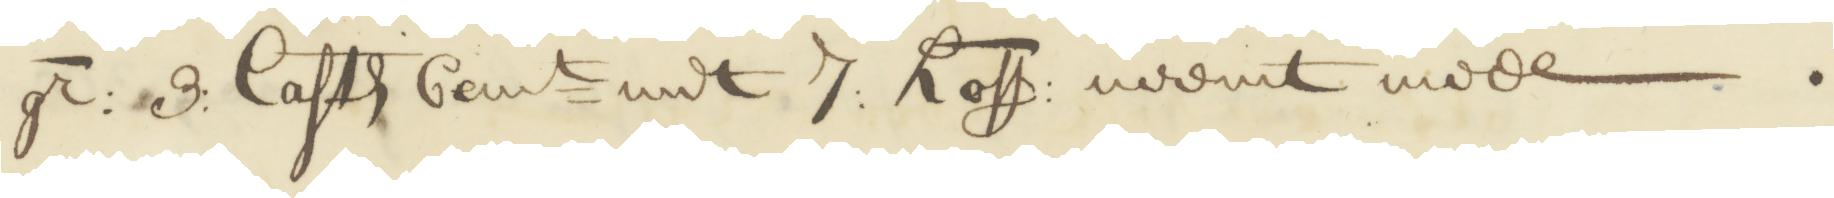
gr: 3: lasten bem=t met 7: kopp: neemt mede.
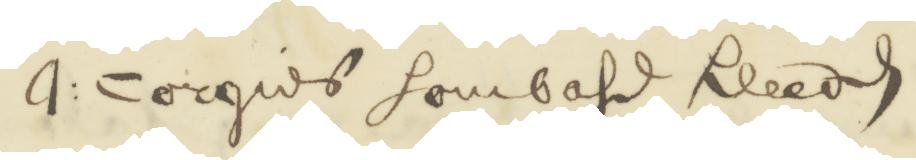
4: corgies sombase kleeden
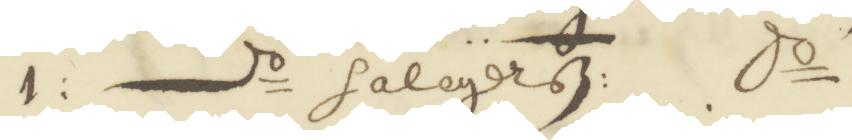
1: _=o saleijers: d=o
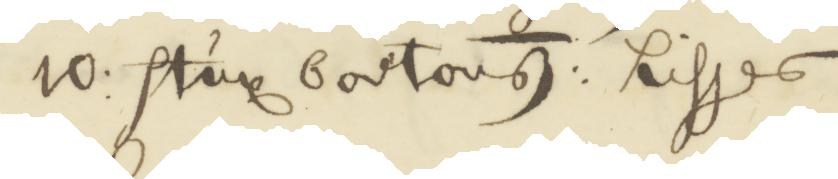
10: stux boetons: kisjes
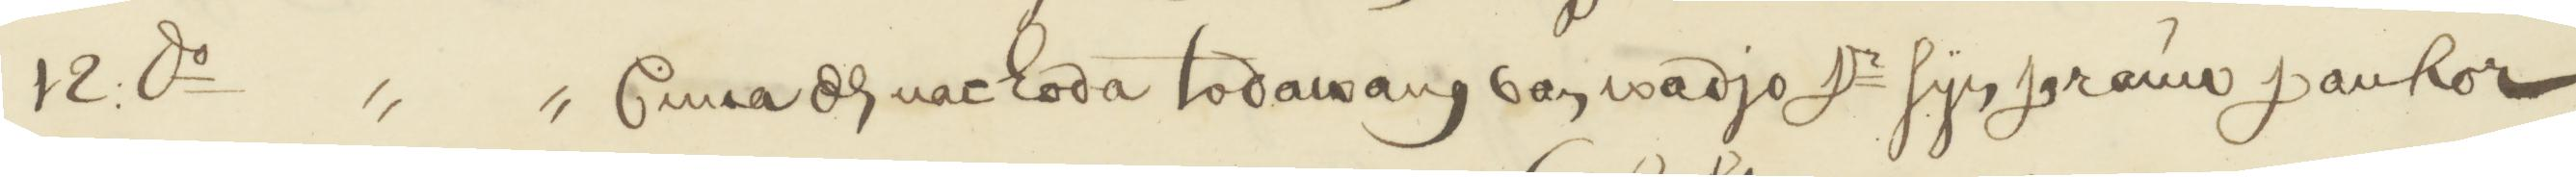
12: d=o „ „ bima den nachoda todawang van wadjo p=r sijn prauw pankor
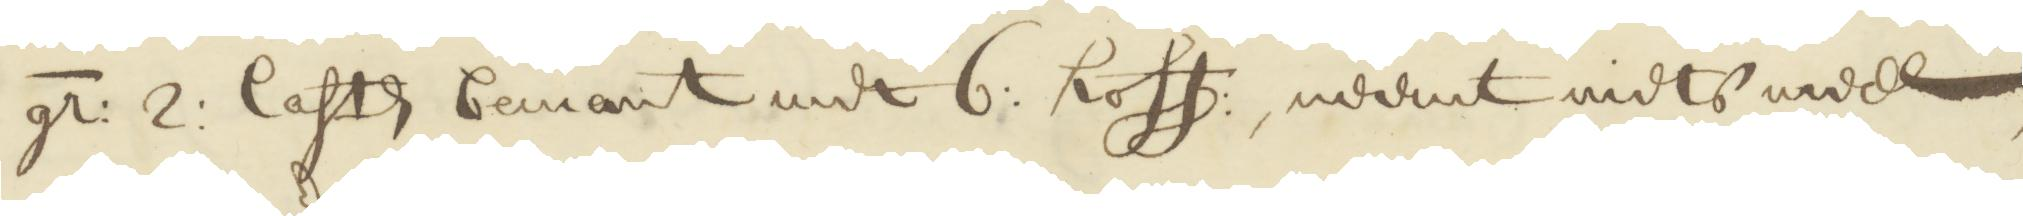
gr: 2: lasten bemant met 6: kopp:, neemt niets mede
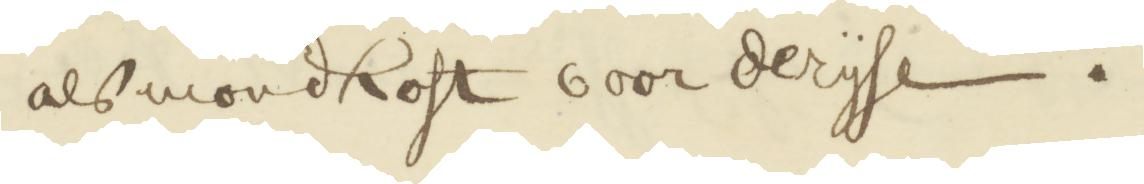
als mondkost voor derijse.
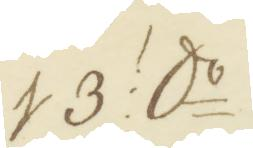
13:' d=o
